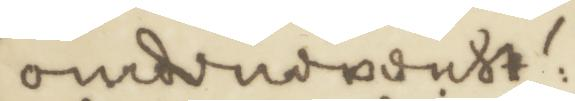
om de nevenst':
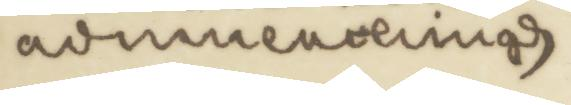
aenmerckingen
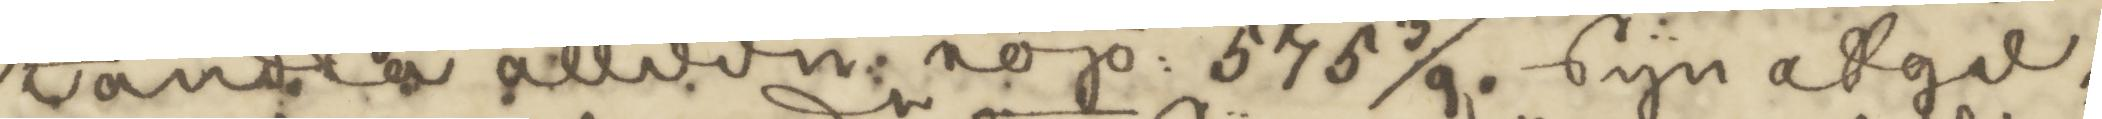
Candha alleen rop: 575 3/9. sijn afge„
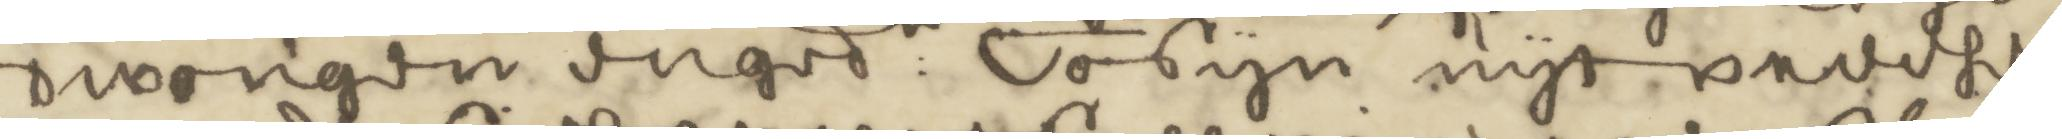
dwongen en ged:t Cosijn uijt vreese
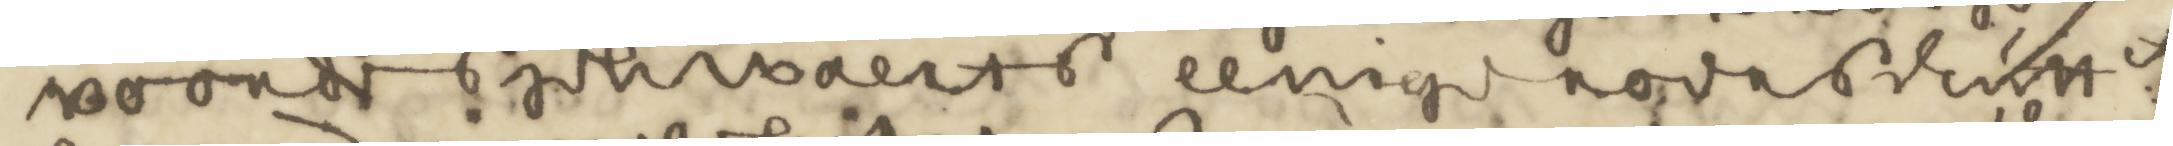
voor des jekwaerts eenige roerschutt:s
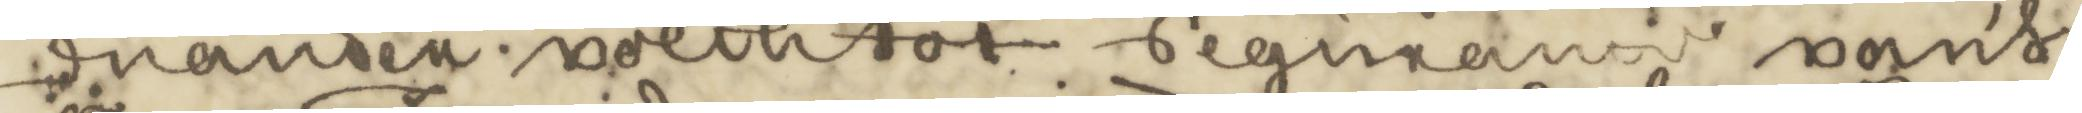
en ander volck tot segurance van 's
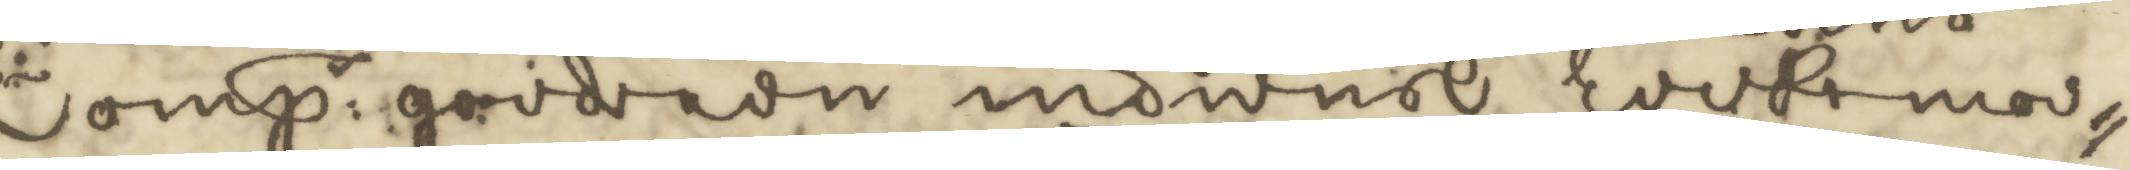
Comp:s goederen indienst heeft moe„
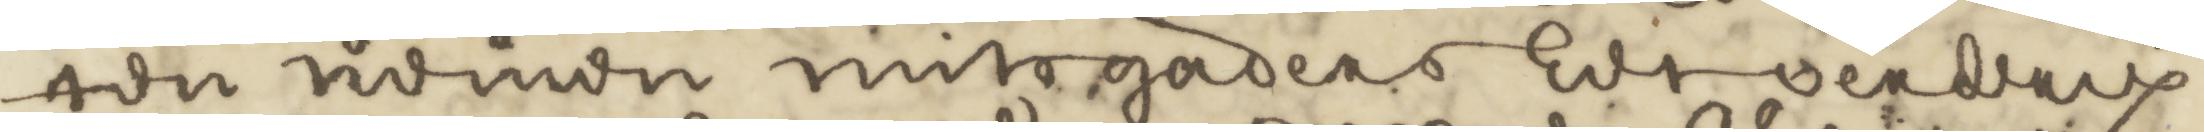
ten nemen mitsgaders het verdere
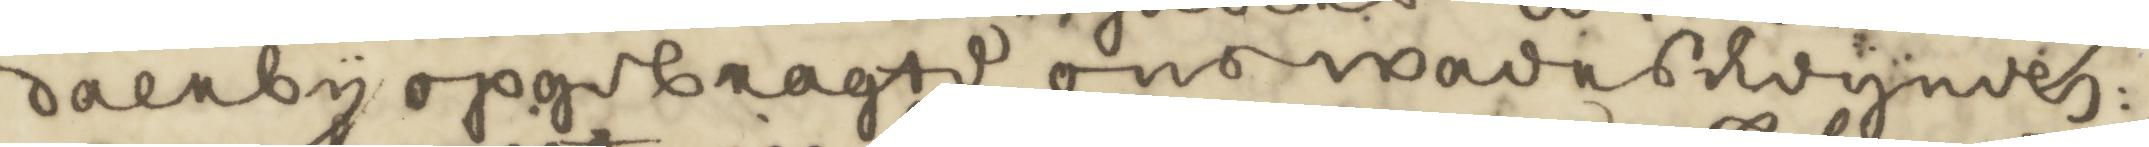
daerbij opgebragte ons waerscheijnelijk:
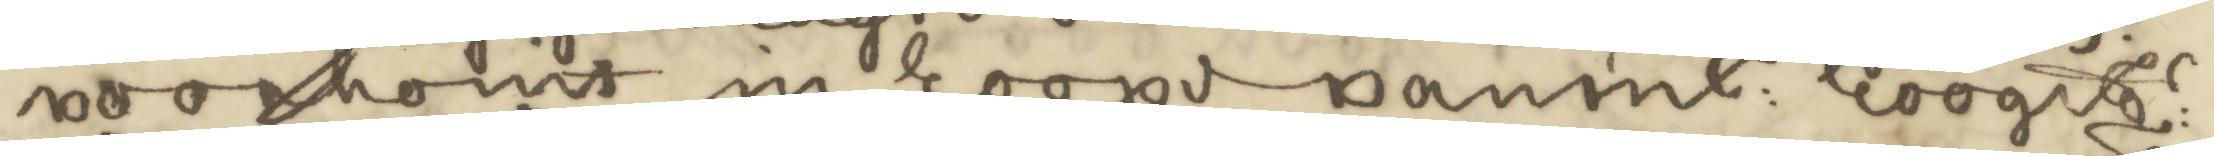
voorkomt in hoope van uE: hoogEd:s
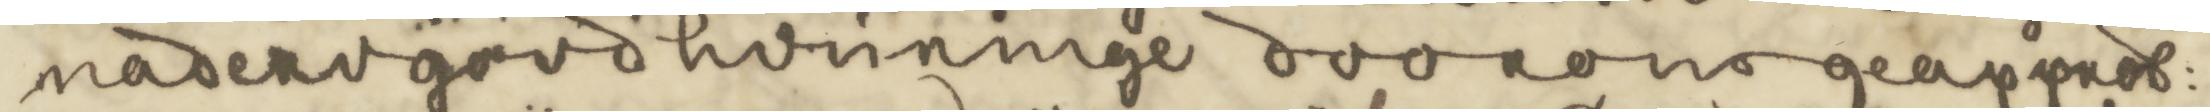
nadere goed keuringe door ons geapprob:
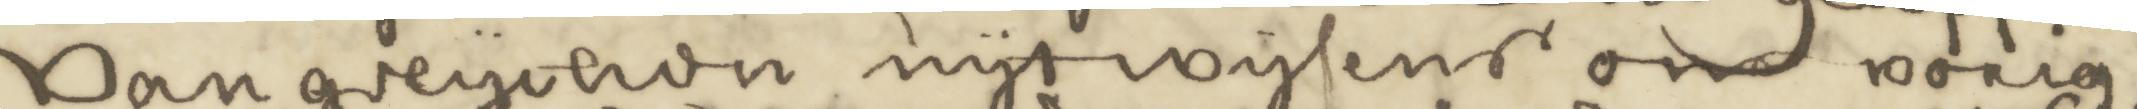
van gelijcken uijtwijsens om vorig
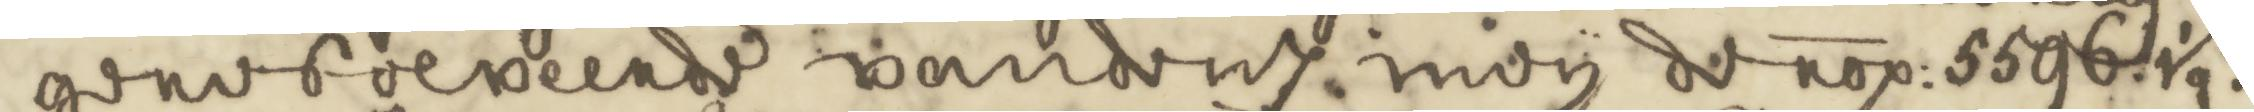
geresolveerde van den 7 meij de rop: 5596. 1¼.
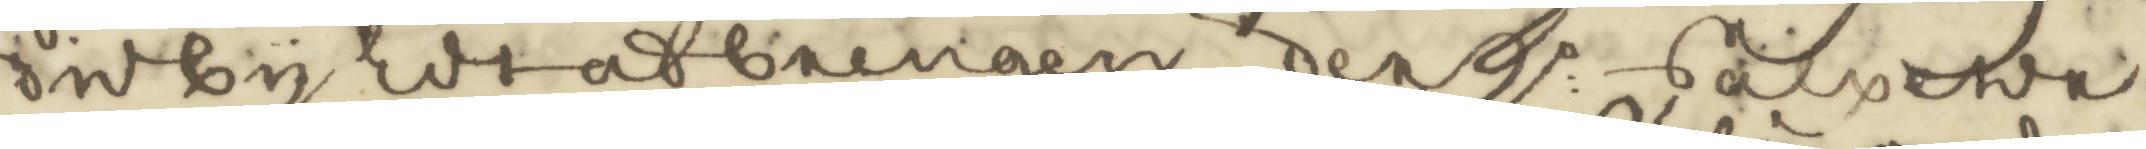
die bij het afbrengen der J:o salpeter
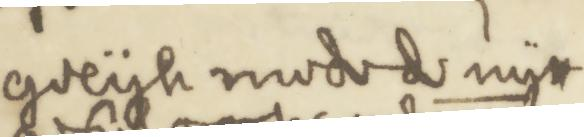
gelijk mede de uijt
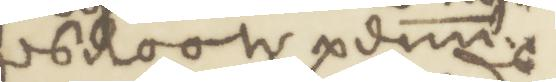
geschoote penn:
